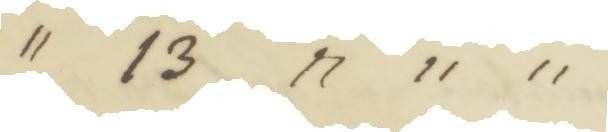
„ 13 „ „ „
